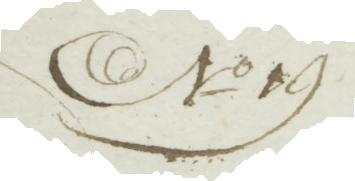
N-o 19
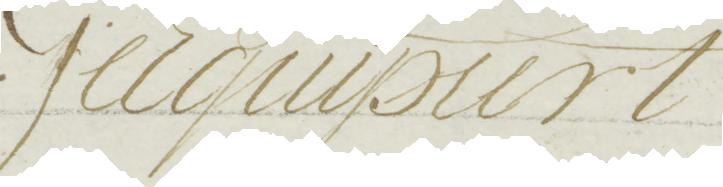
Geequipeert
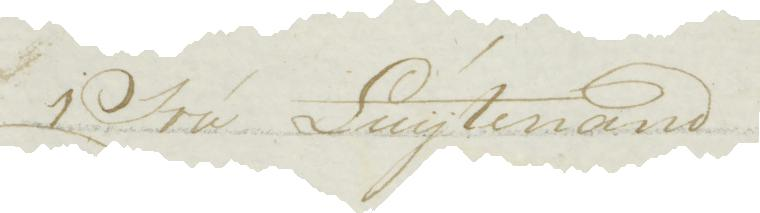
1 Sou Luijtenand
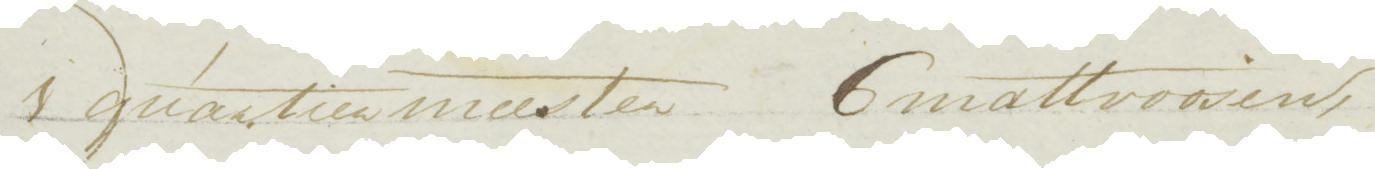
1 quartier meester 6 mattroosen,
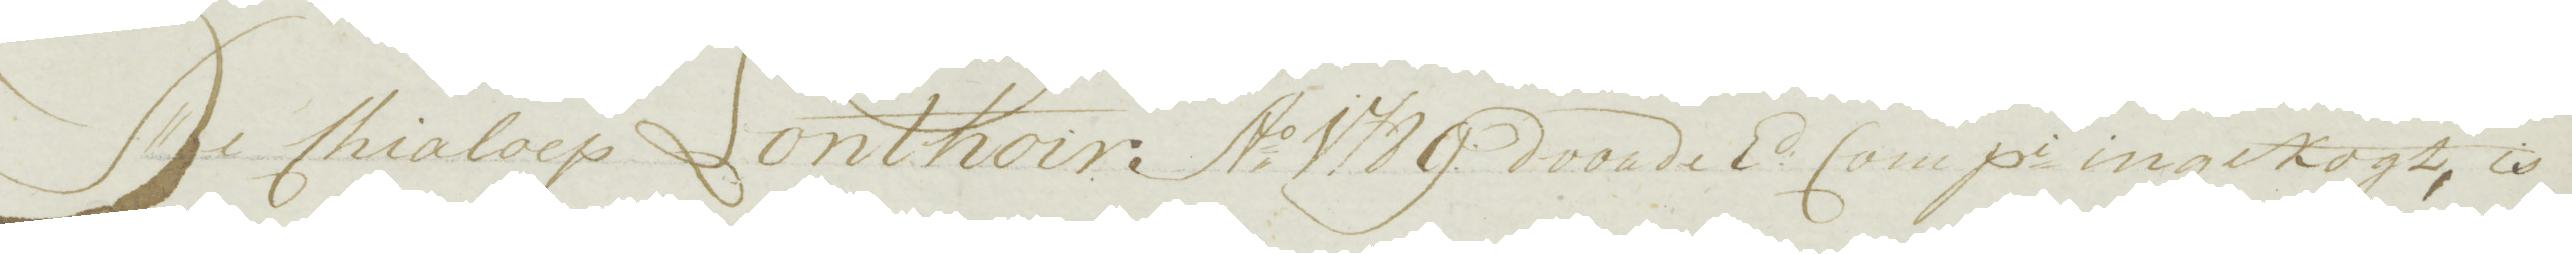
De Chialoep Lonthoir A„o 1789: door de E: Comp=i ingekogt, is
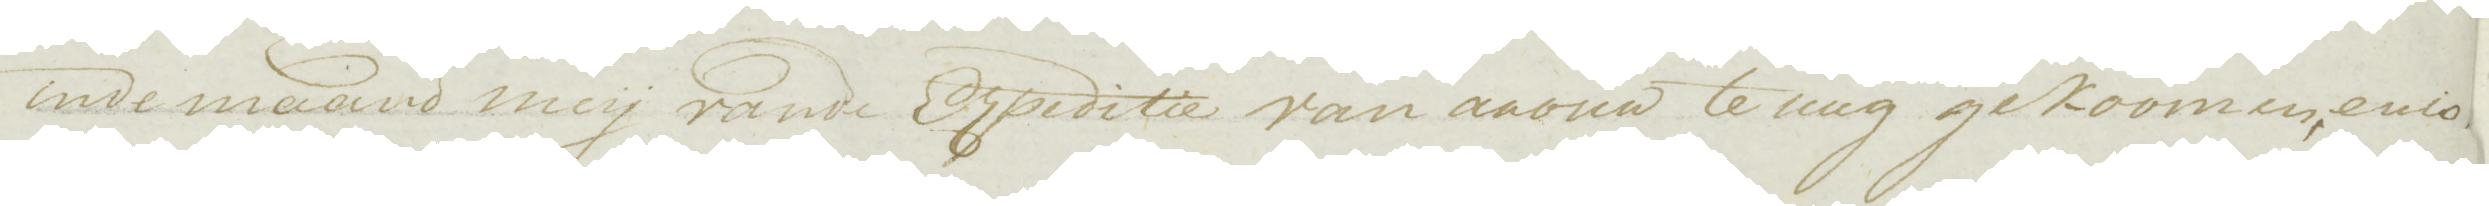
inde maand meij vande Expeditie van arouw te rug gekoomen, en is
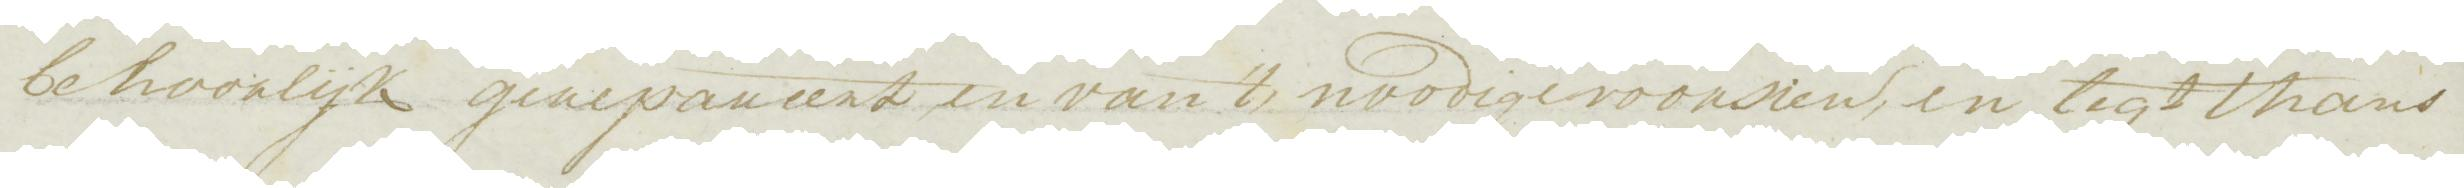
behoorlijk gerepareert en van ’t noodige voorsien, en legt thans
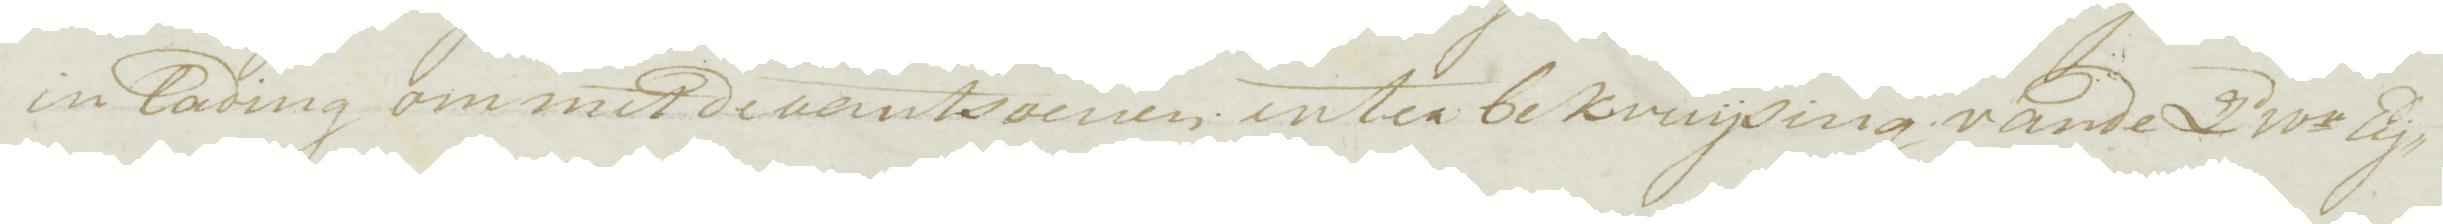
in lading om met de rantsoenen en ter bekruijsing vande zd w=r Eij„
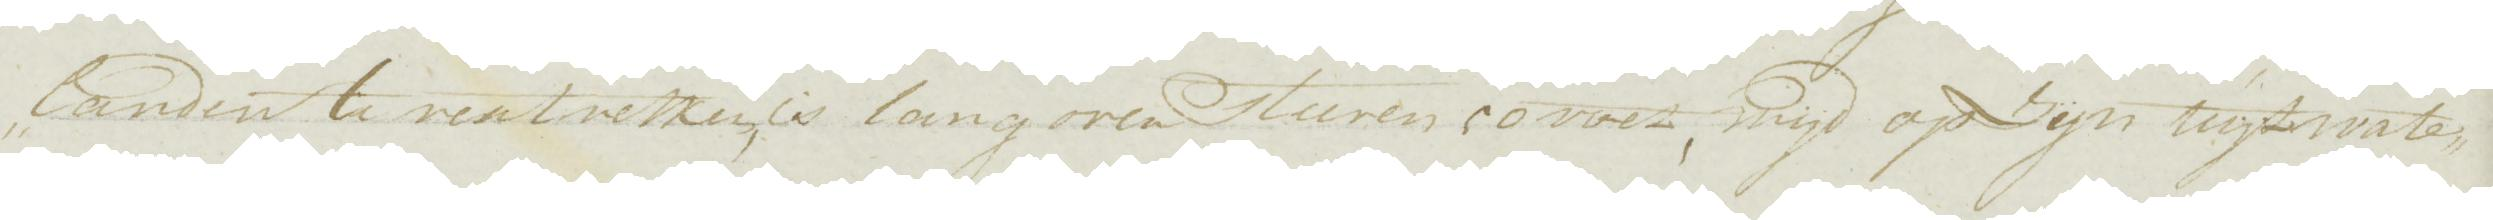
„landen te vertrekken, is lang over sturen 50 voet, wijd op zijn uijtwate„
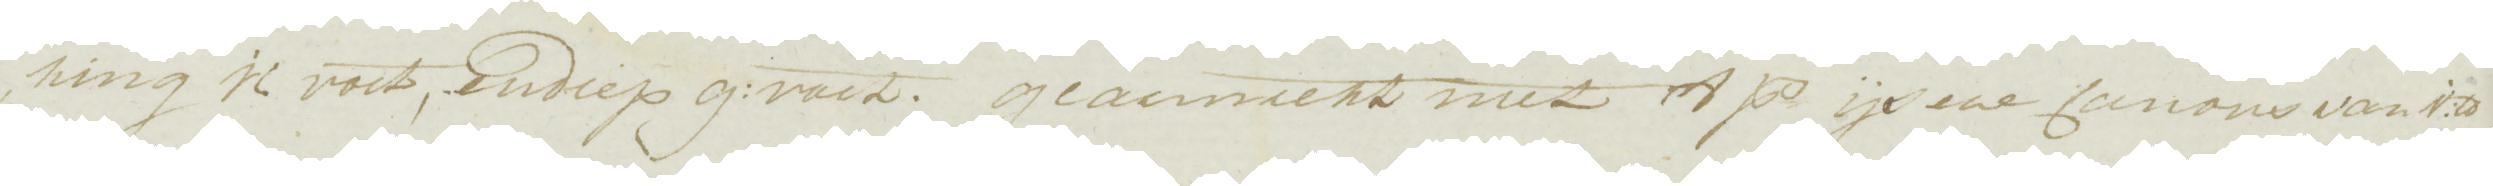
„ring 15 voet, endiep 9: voet. gearmiert met 8 p„s ijsere Canons van 1: lb
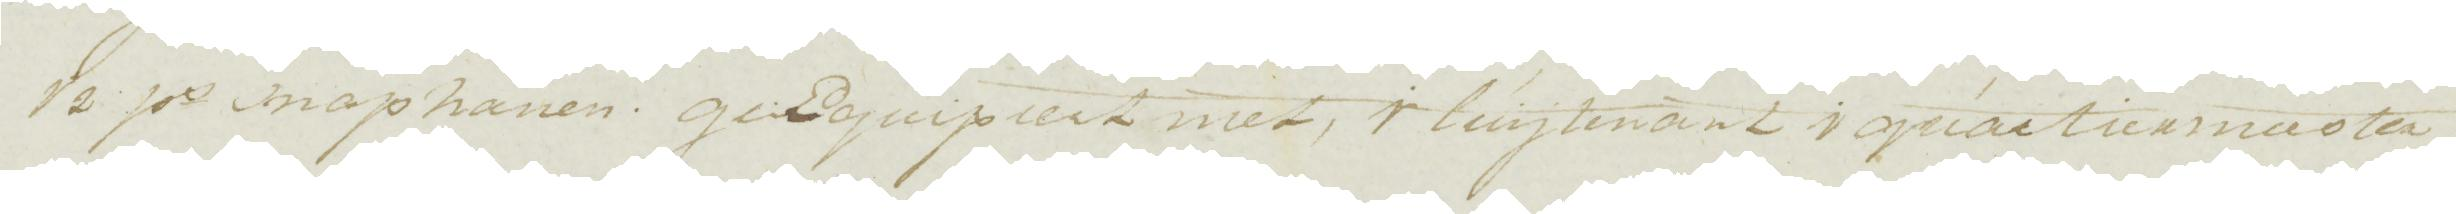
12: p=s snaphanen geEquipeert met, 1 luijtenant 1 quartiermeester
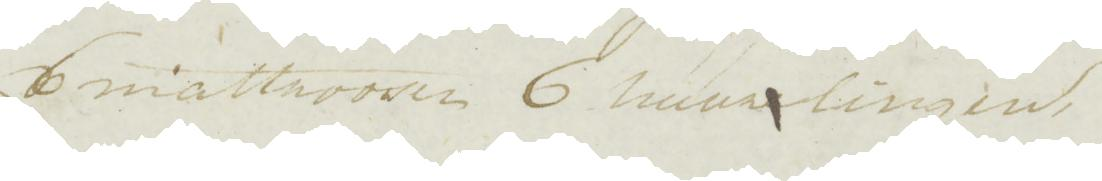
6 mattroosen 6 huurelingen,
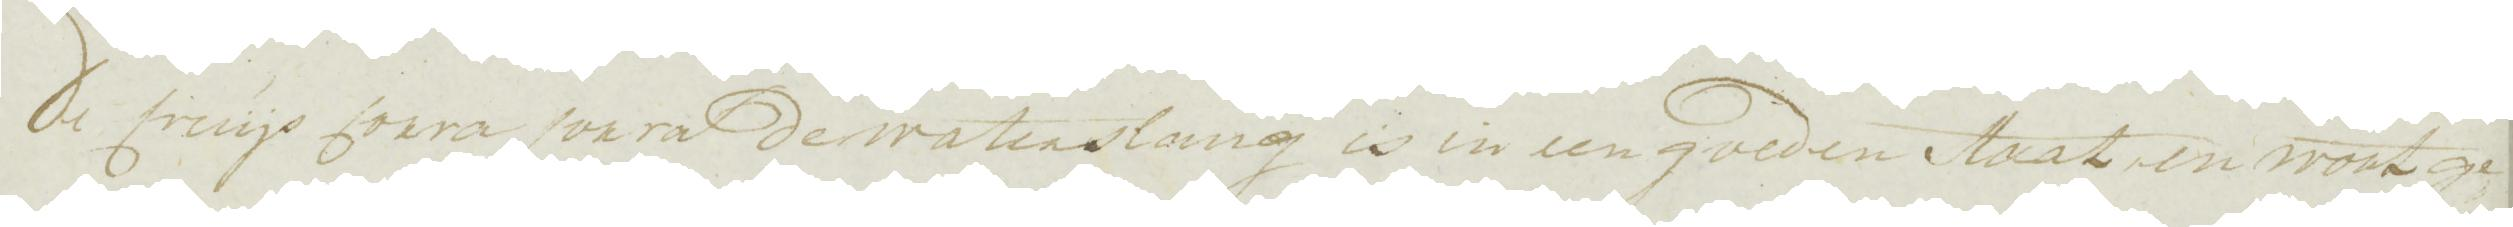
de cruijs corra corra de waterslang is in een goeden staat, en wort ge
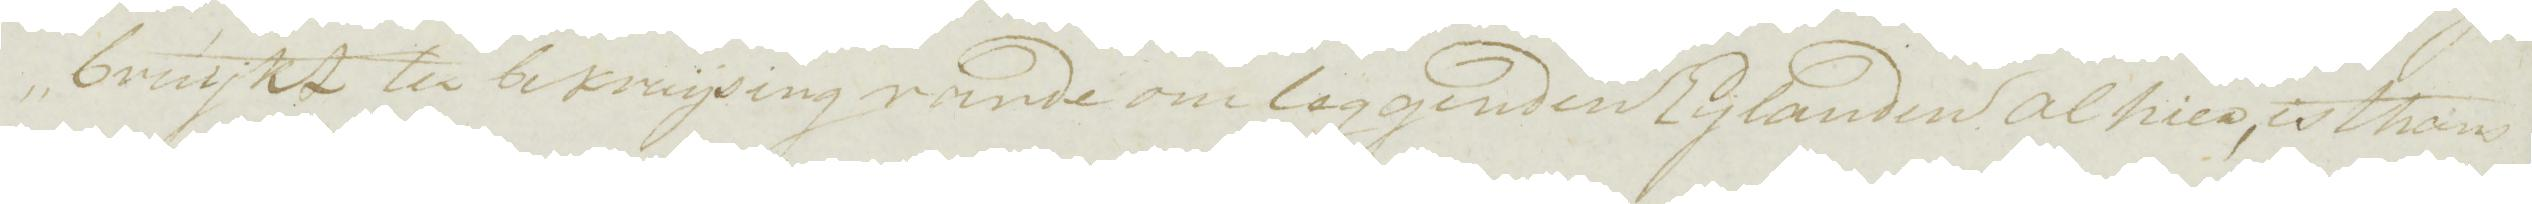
„bruijkt ter bekruijsing vande omleggenden Eijlanden alhier, is thans
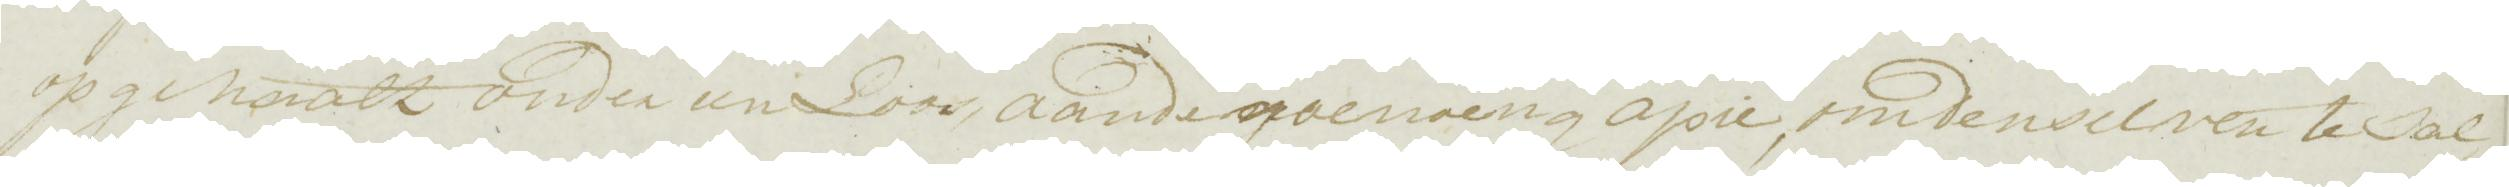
opgehaalt onder een Loos, aande goenoeng apie, omdenselven te sal„
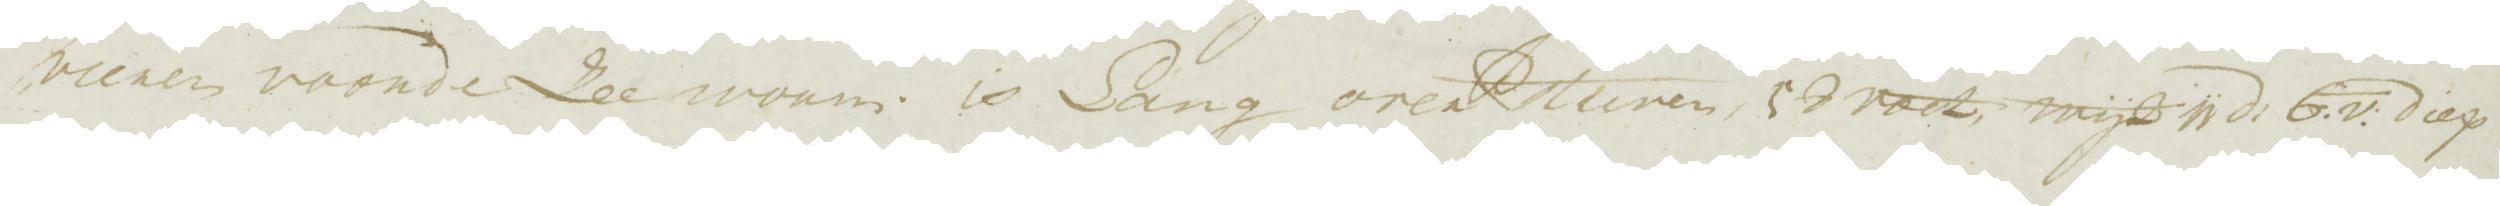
„vieren voorde zeeworm is Lang over sturen, 58 voet, wijt 11 d: 6: v: diep
